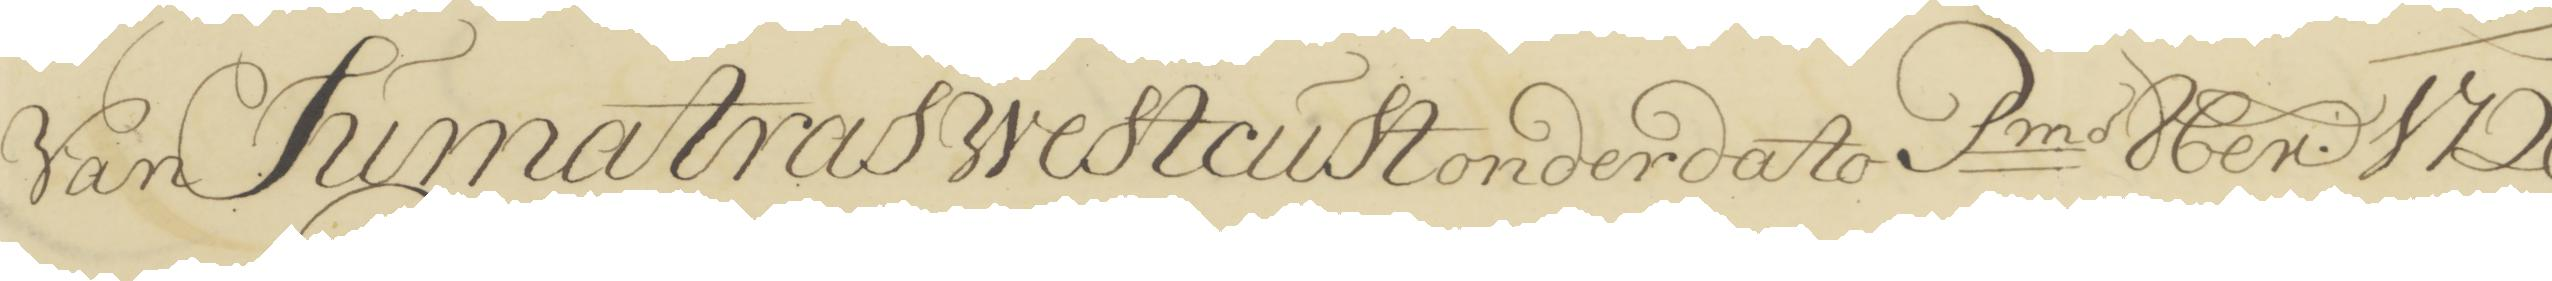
van Sumatras Westcust onderdato P=mo 8ber 1729.
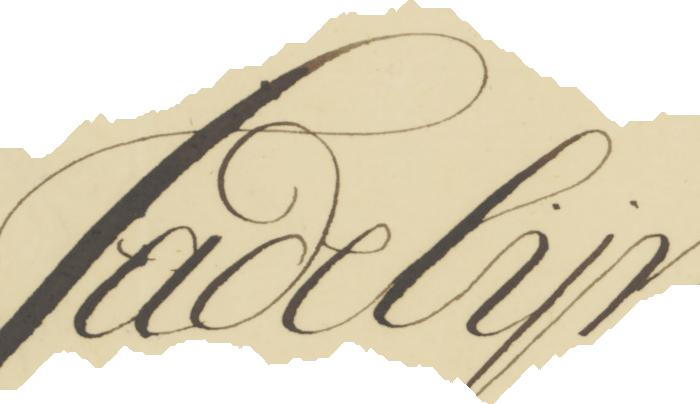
Sadelijn
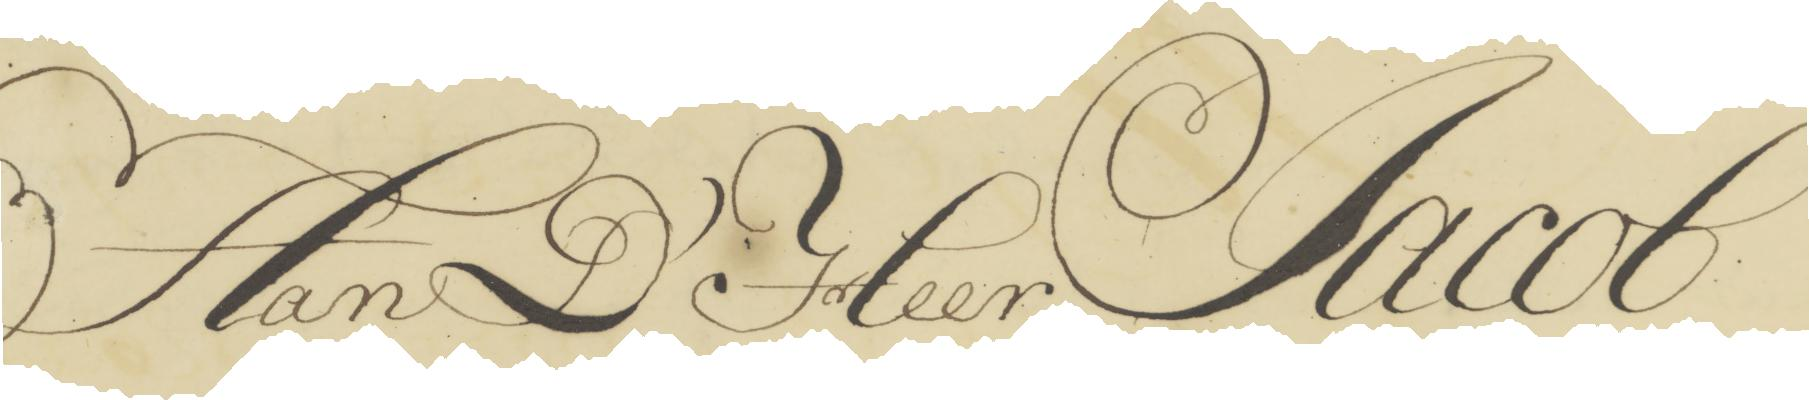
Aan D'Heer Iacob
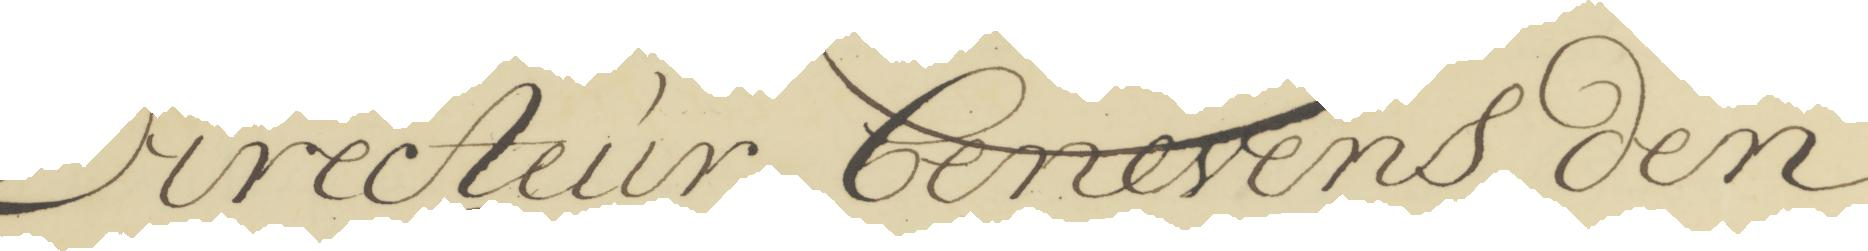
Directeur, benevens den
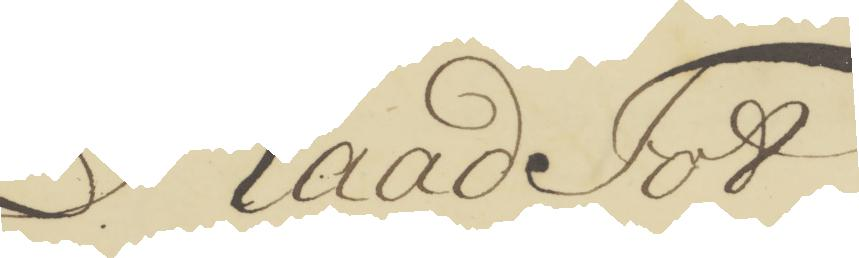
Raade Tot
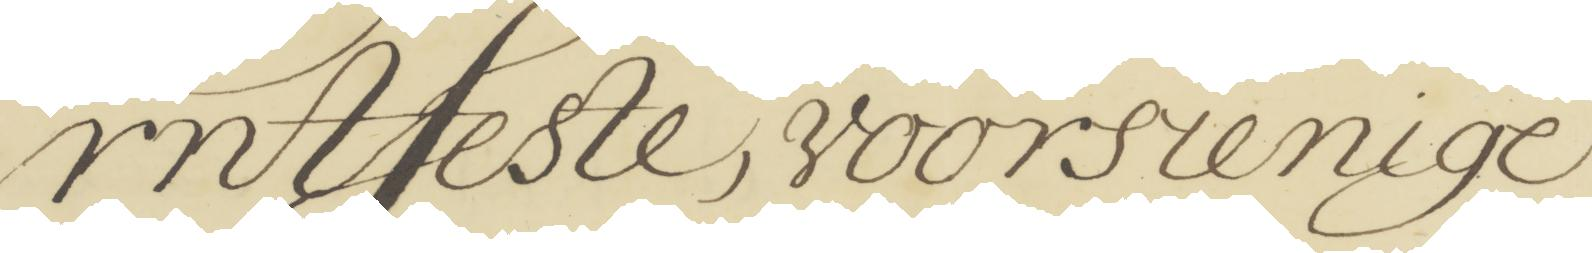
Erntfeste, voorsienige
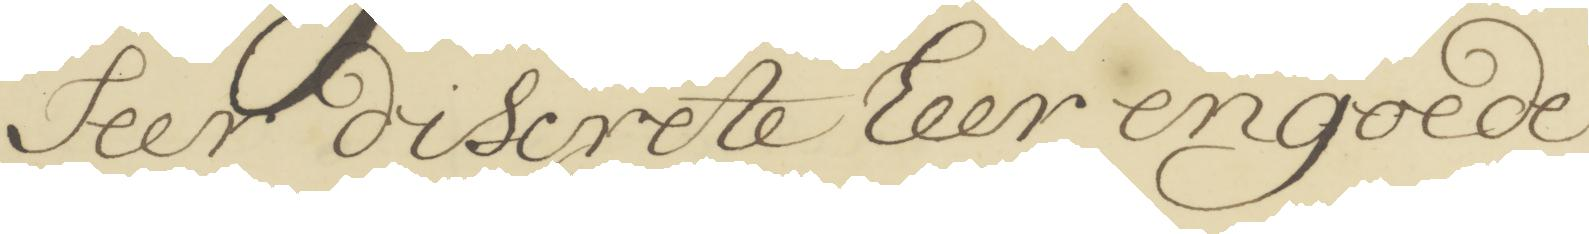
seer discrete heer en goede
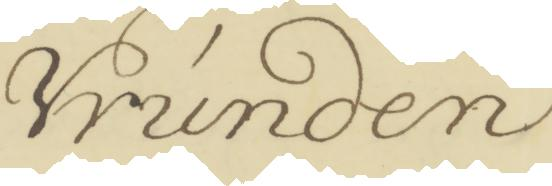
vrunden
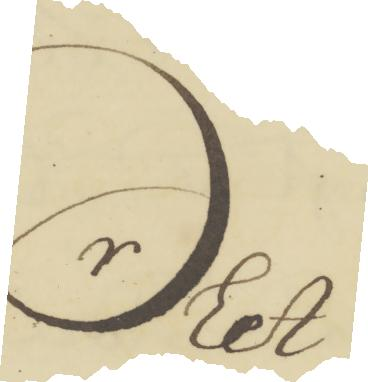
r het
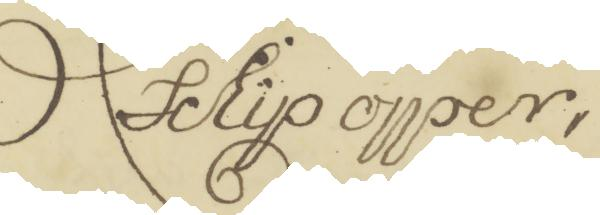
schip opper„
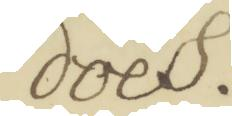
does.
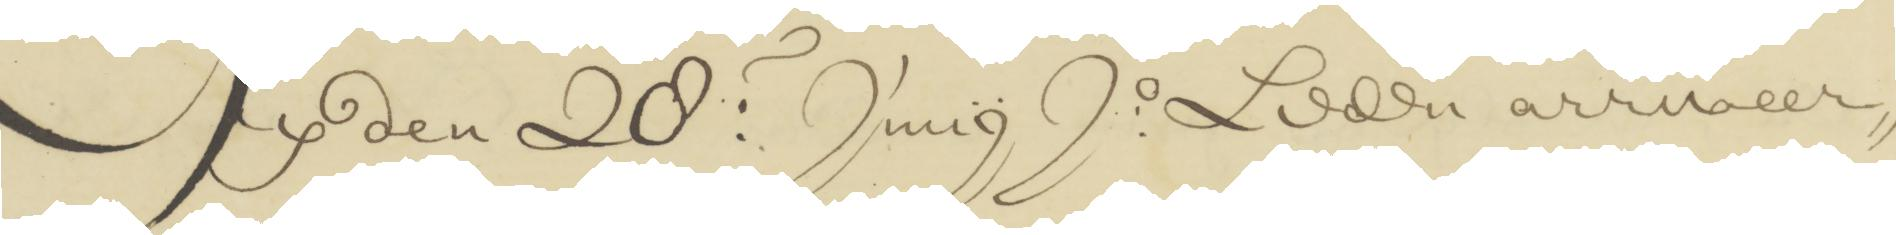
Op den 28:' Junij J:o leden arriveer„
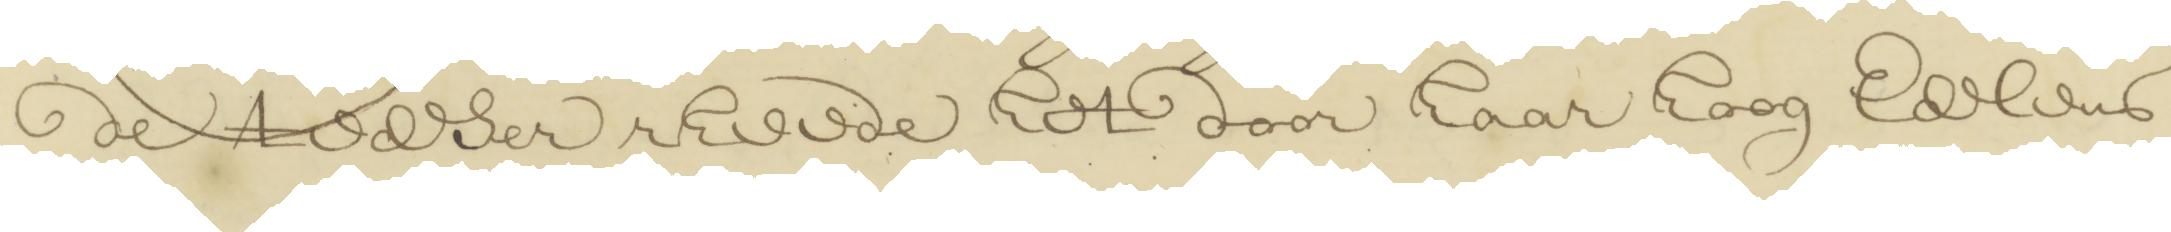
de te deser rheede het door haar hoog Edelens
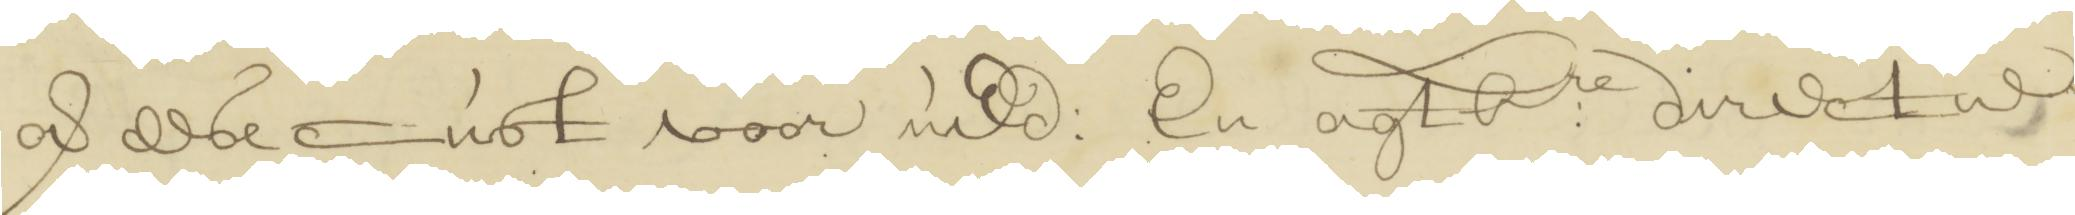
over dese cust voor uEd: En agtb:re directie
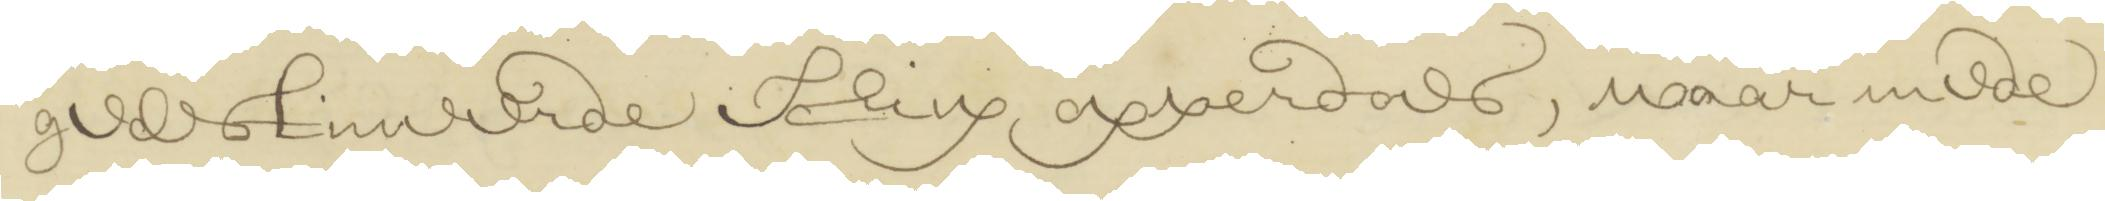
gedestineerde schip opperdoes, waar mede
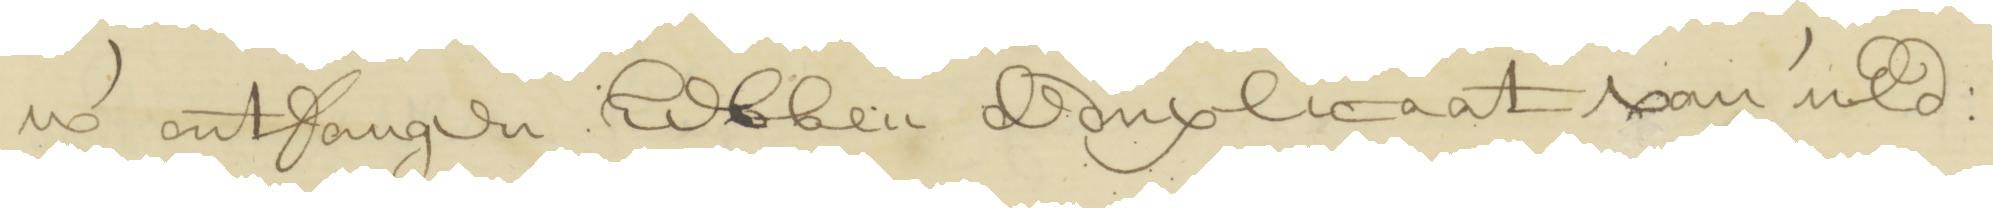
w' ontfangen hebben de duplicaat van uEd:
